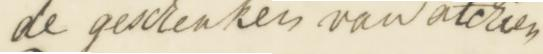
de geschenken van atchien
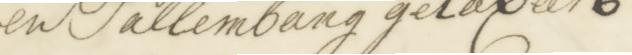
en Pallembang getaxeert
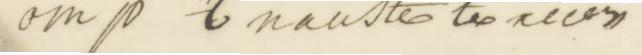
om p„r 't naaste te recon
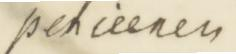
penceeren
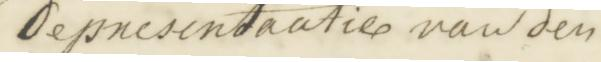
de presentaatie van den
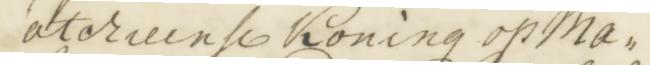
atchieense koning op Ma„
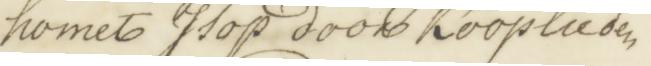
homet Jsop door koopliede
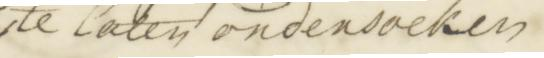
te laten ondersoeken
